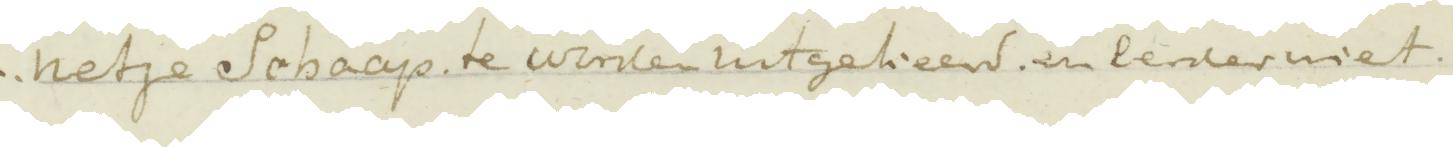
„netje schaap, te worden uitgekeerd, en Eerder niet.
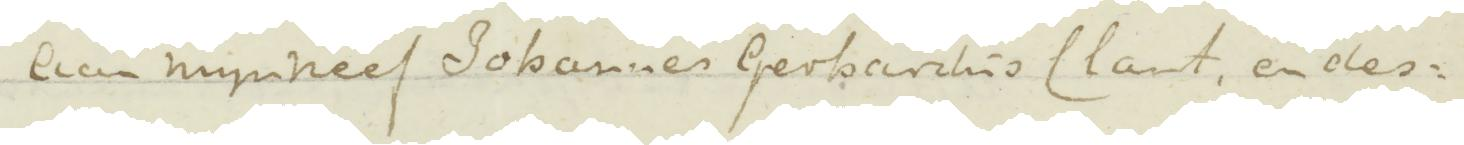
Aan myn neef Johannes Gerhardus Clant, en des=
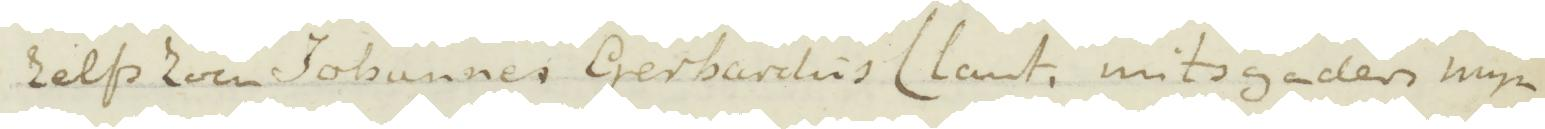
zelfs Zoon Johannes Gerhardus Clant, mitsgaders myn
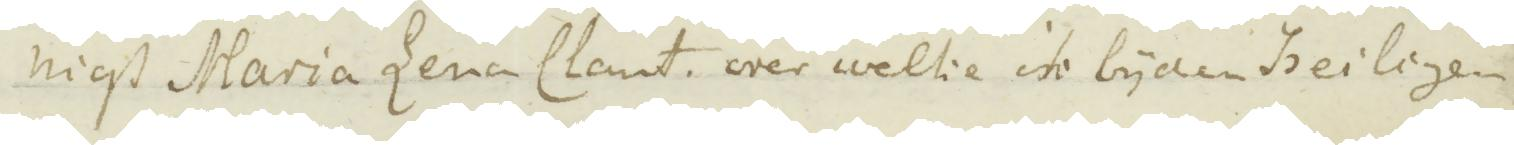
nigt Maria Lena Clant, over welke ik bij den heiligen
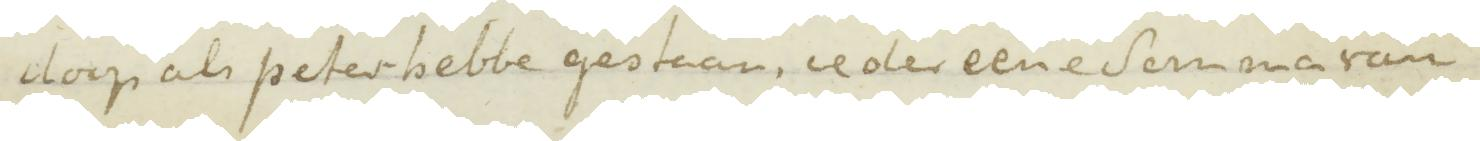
doop als peter hebbe gestaan, ieder eene somma van
